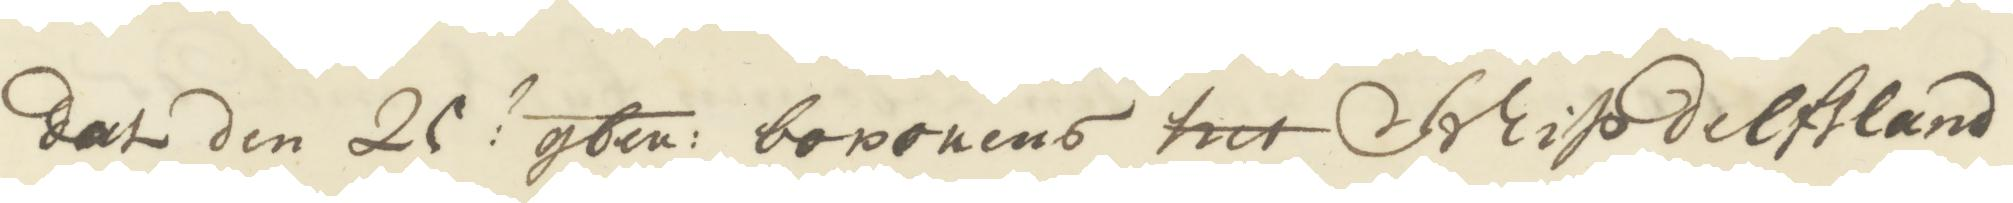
dat den 25:' 9ber: bovorens het Schip delfsland
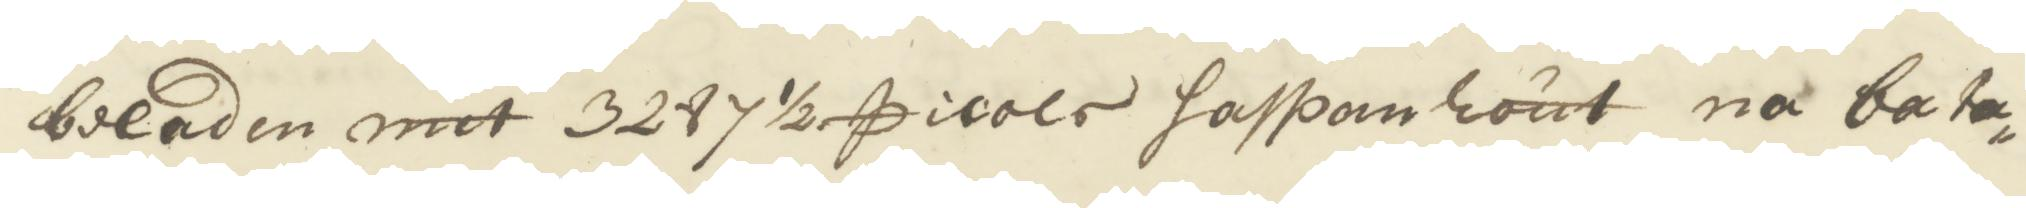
beladen met 3287½ picols sappanhout na bata„
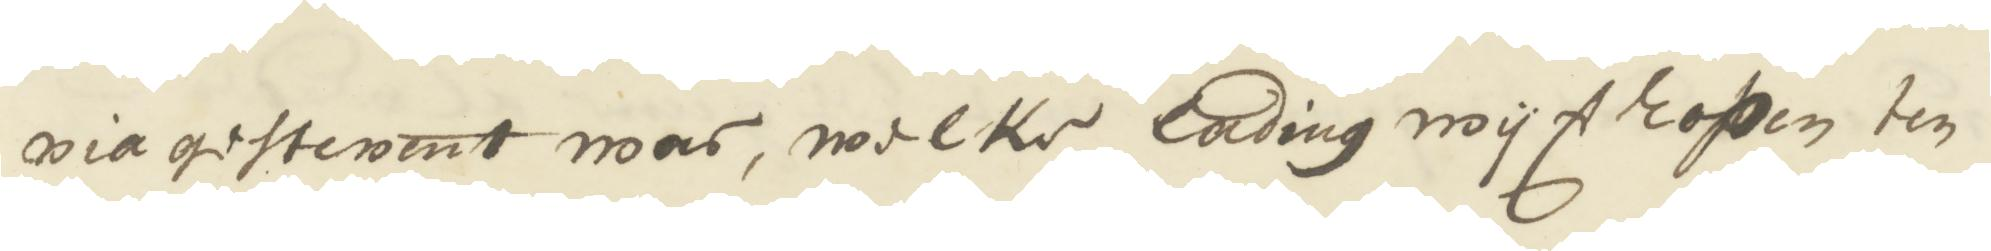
via gestevent was, welke lading wij verhopen ten
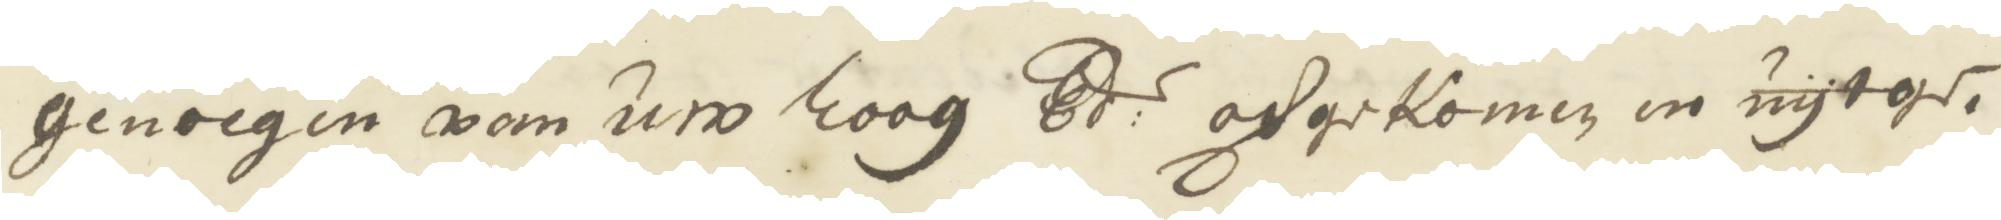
genoegen van uw hoog Ed:s overgekomen en uijtge„
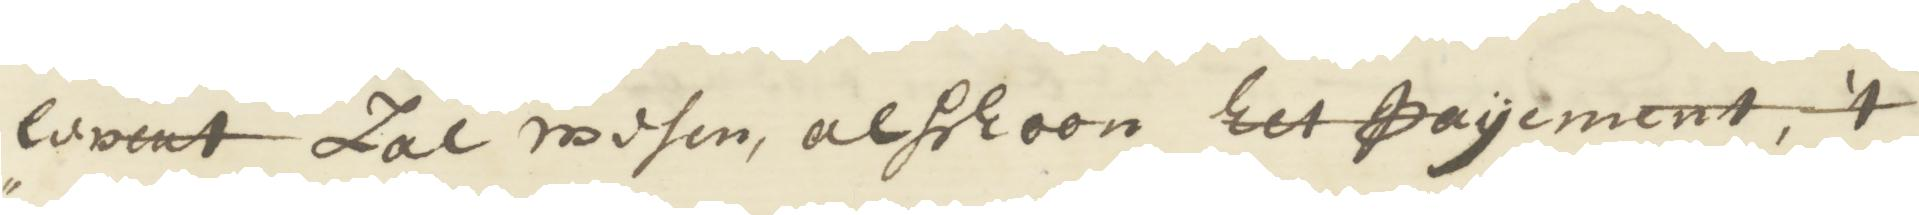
„levert zal wesen, alschoon het paijement, ’t
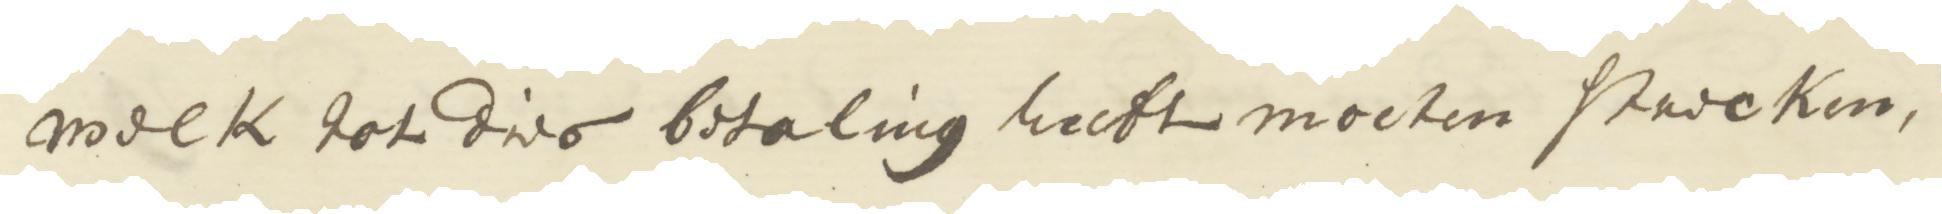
welk tot dies betaling heeft moeten strecken,
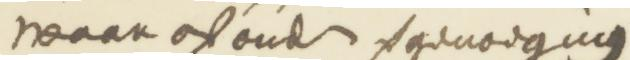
waar over oude vergenoeging
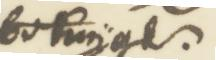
betuijgd.
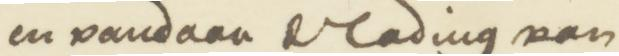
en vandaar delading van
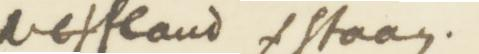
delffland verstaan.
